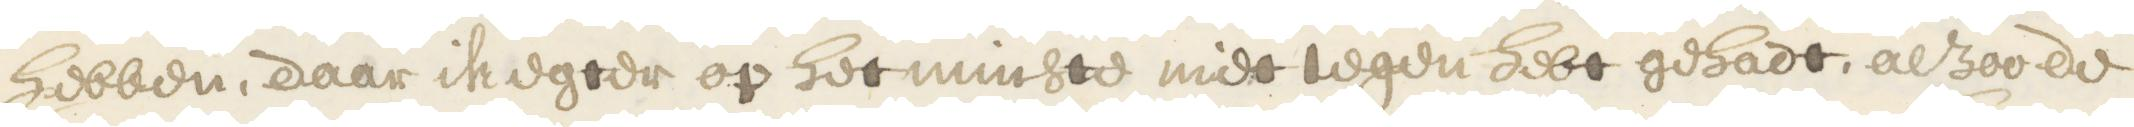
hebben, daar ik egter op het minste niet tegen hebt gehadt, alzoo de
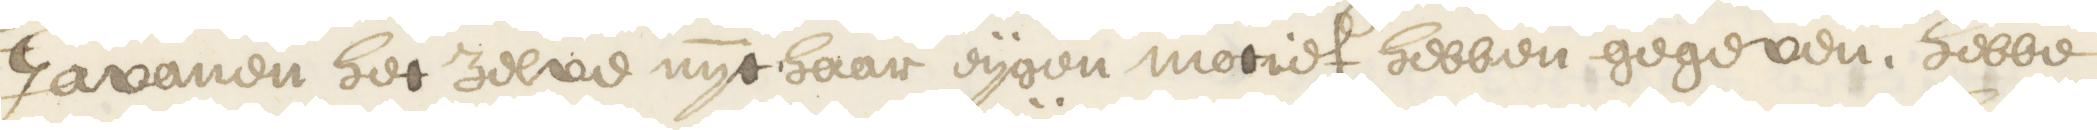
Javanen het zelve uijt haar eijgen motief hebben gegeven, hebbe
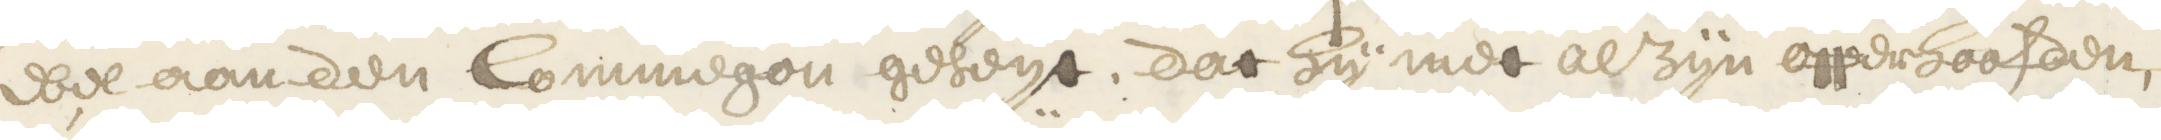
wel aan den Commegon geseijt, dat hij niet al zijn opperhoofden,
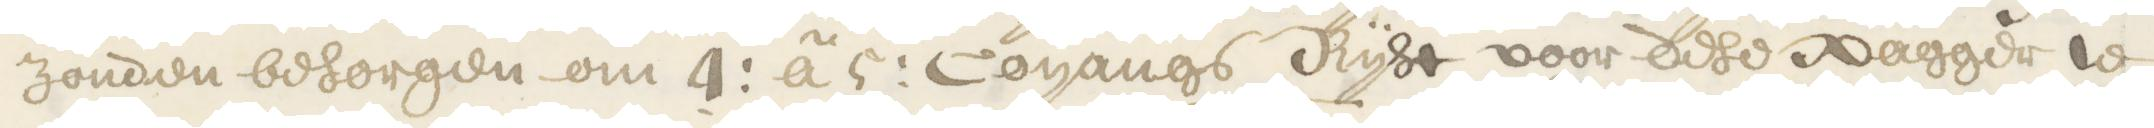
zouden besorgen om 4: á 5: Coijangs Rijst voor dese pagger te
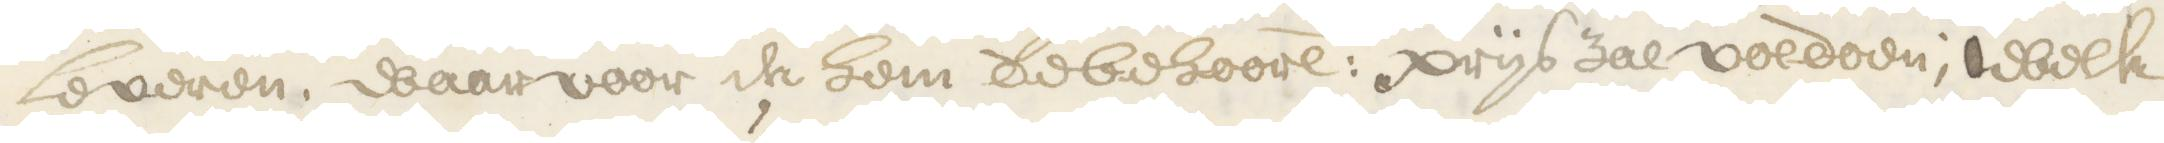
leveren, waarvoor ik hem de behoorl: prijs zal voldoen, 'twelk
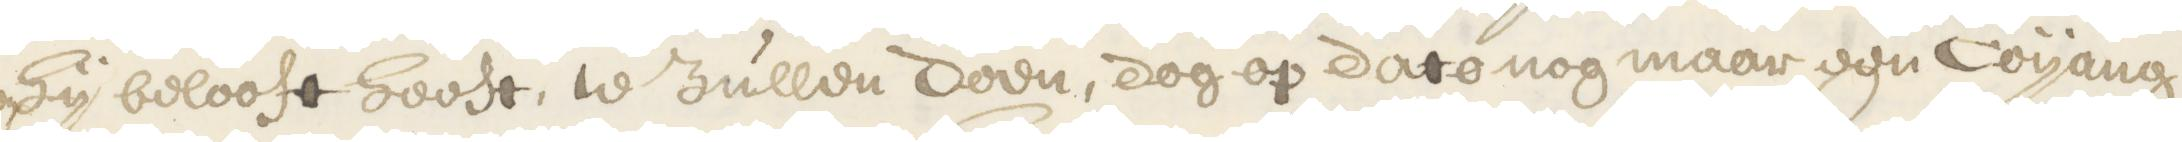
hij belooft heeft, te zullen doen, dog op dato nog maar een Coijang
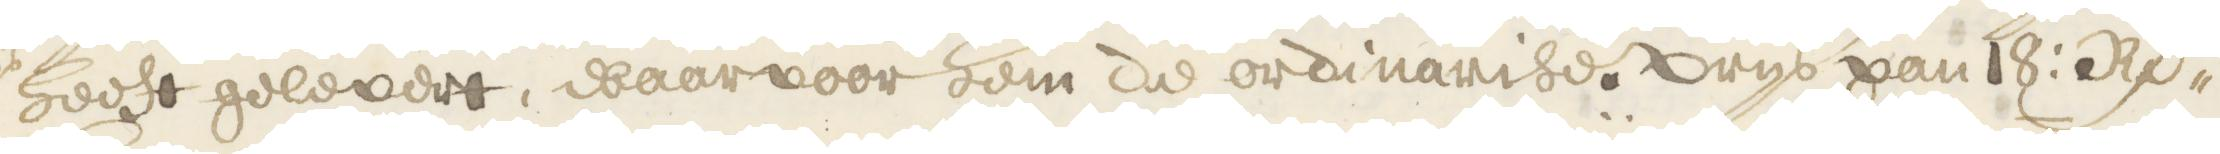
heeft gelevert, waarvoor hem de ordinarise prijs van 18: Rd„s
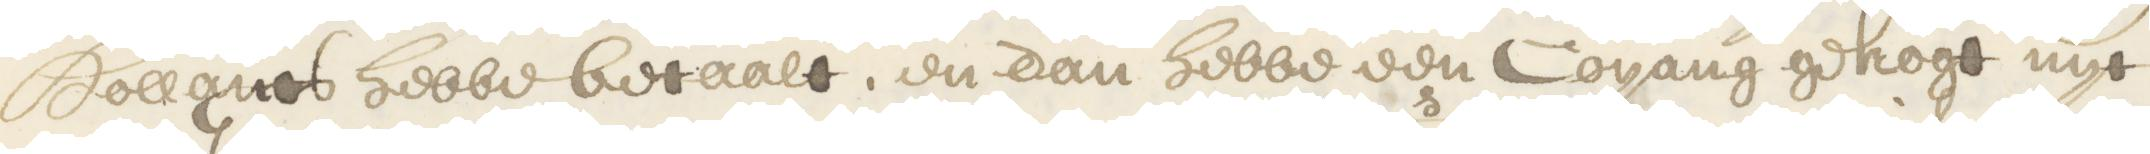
Hollants hebbe betaalt, en dan hebbe een Coijang gekogt uijt
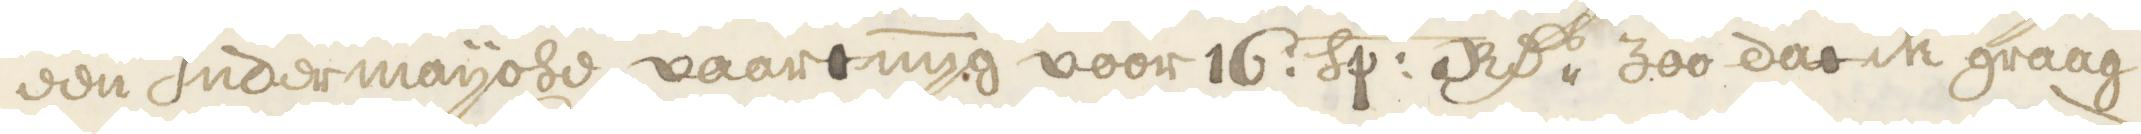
een Indermaijose vaartuijg voor 16: sp: Rd„s zoo dat in graag
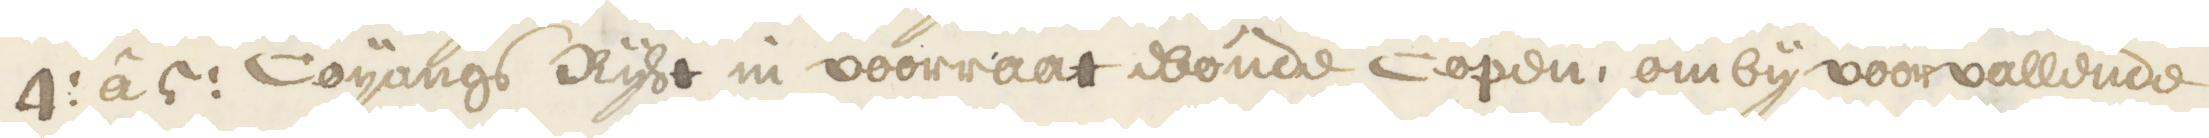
4: á 5: Coijangs Rijst in voorraat woude copen, om bij voorvallende
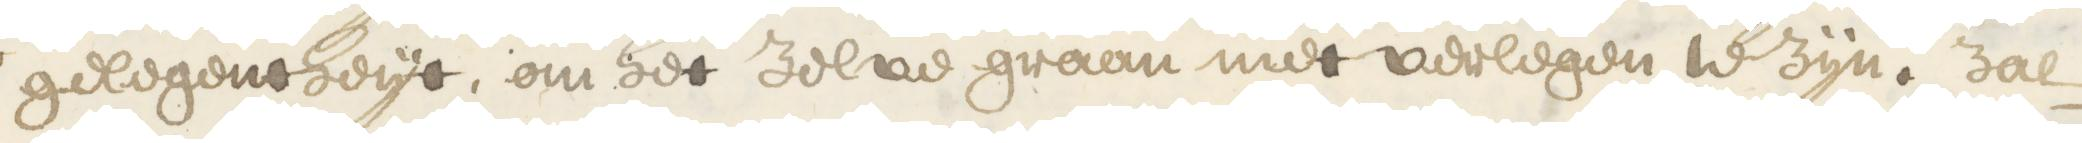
gelegentheijt, om het zelve graan niet verlegen te zijn, zal
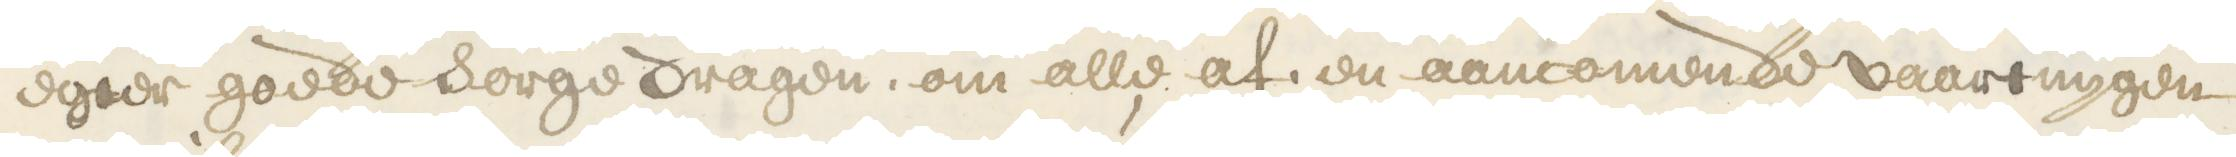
egter goede sorge dragen, om alle af, en aancomende vaartuijgen
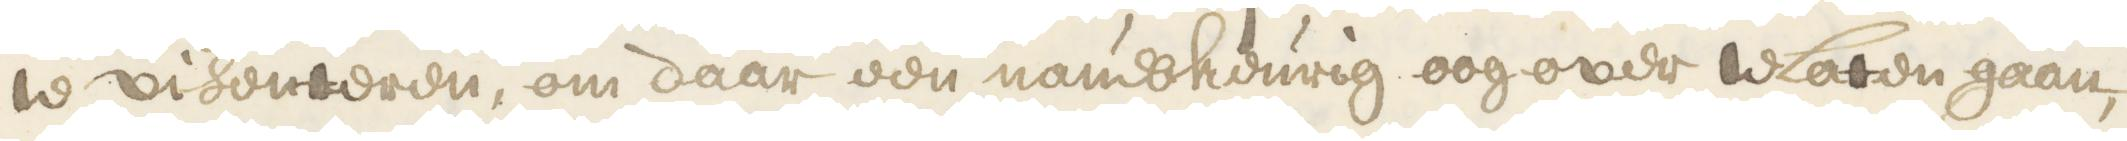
te visenteren, om daar een nauwkeurig oog over te laten gaan,
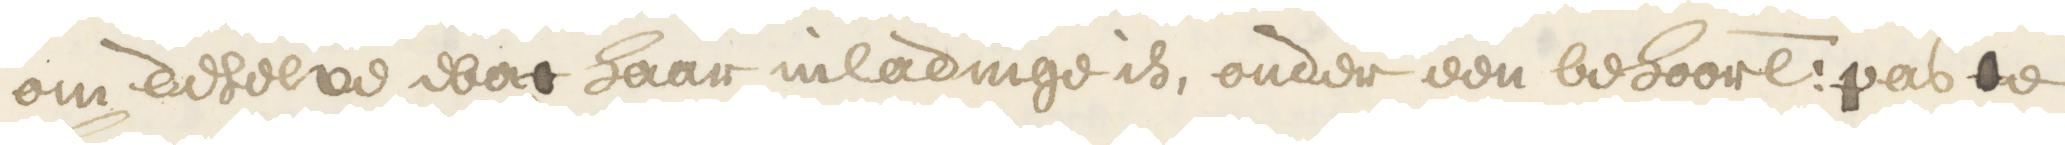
om deselve wat haar inladinge is, onder een behoorl: pas te
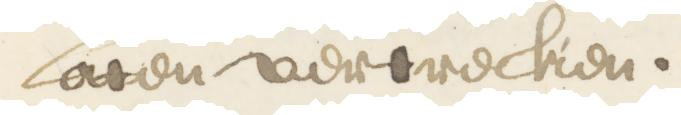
laten vertrecken.
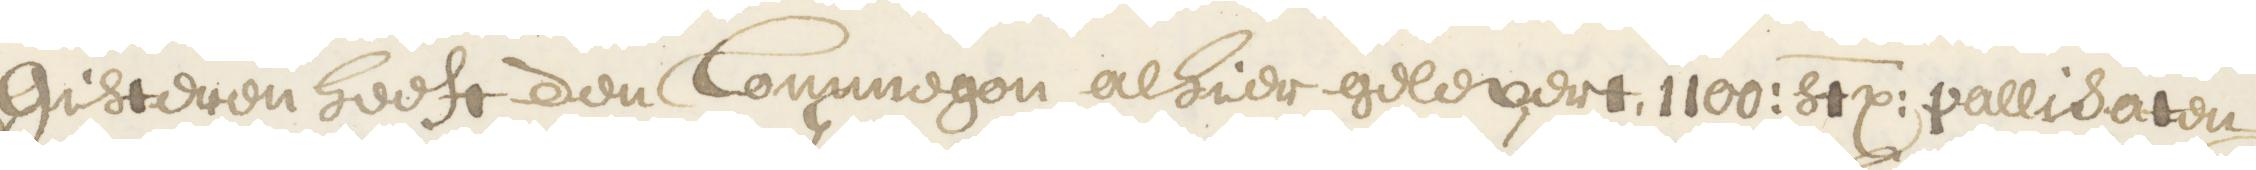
Gisteren heeft den Commegon alhier gelevert, 1100: stx: pallisaten,
